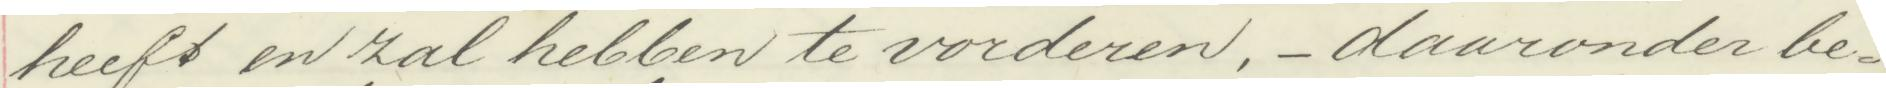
heeft en zal hebben te vorderen, – daaronder be=
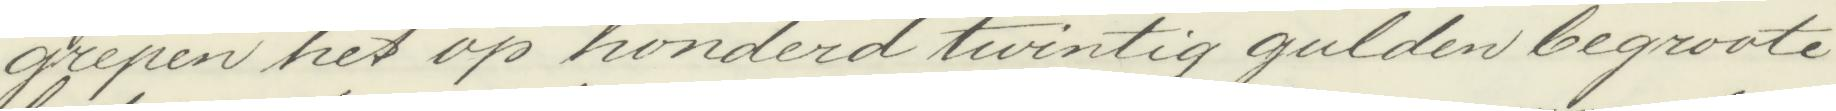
grepen het op honderd twintig gulden begroote
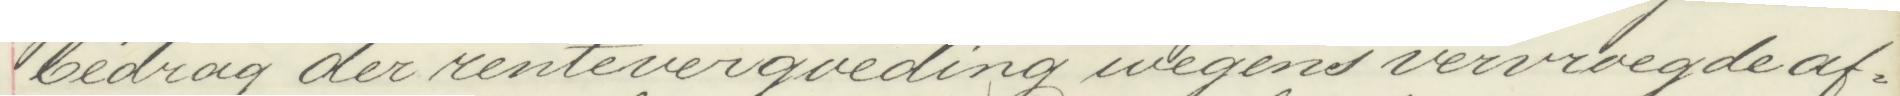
bedrag der rentevergoeding wegens vervroegde af=
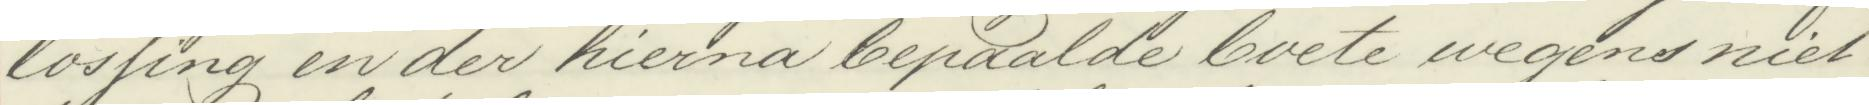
lossing en der hierna bepaalde boete wegens niet
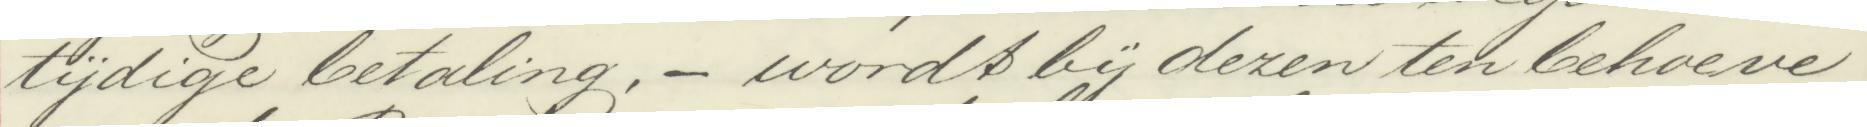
tijdige betaling, – wordt bij dezen ten behoeve
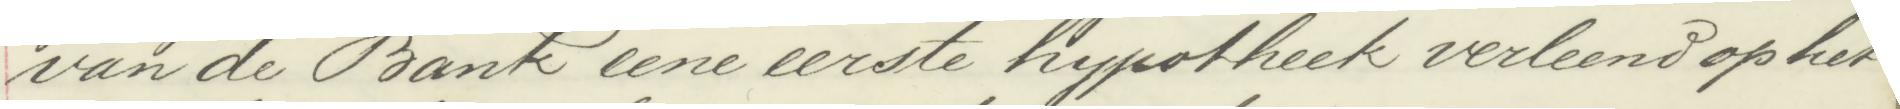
van de Bank eene eerste hypotheek verleend op het
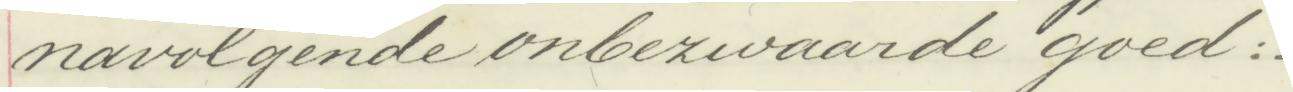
navolgende onbezwaarde goed:
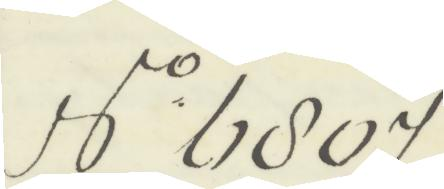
N=o 6807.
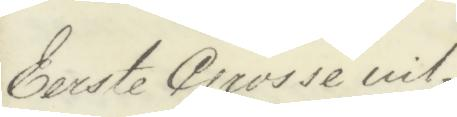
Eerste Grrosse uit
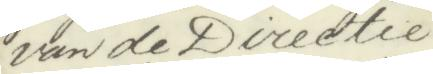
van de Directie
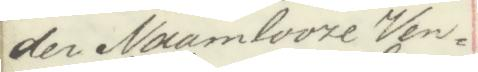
der Naamlooze Ven=
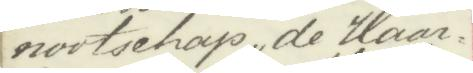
nootschap „ de Haar
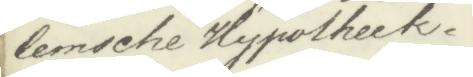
lemsche Hypotheek=
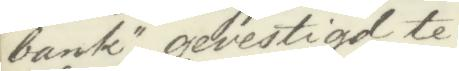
bank", gevestigd te
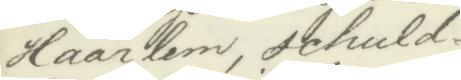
Haarlem, schuld
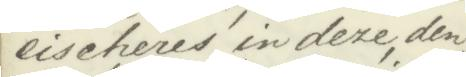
eischeres in deze, den
